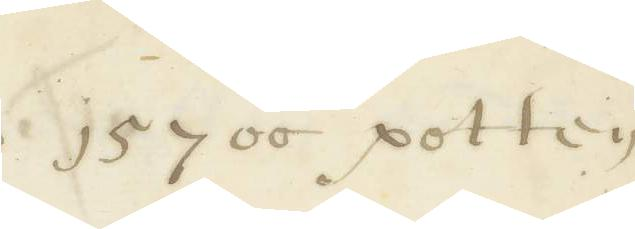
15700 potten
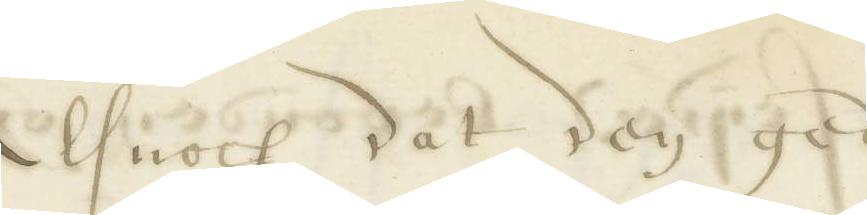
Alsnog dat den ged=e
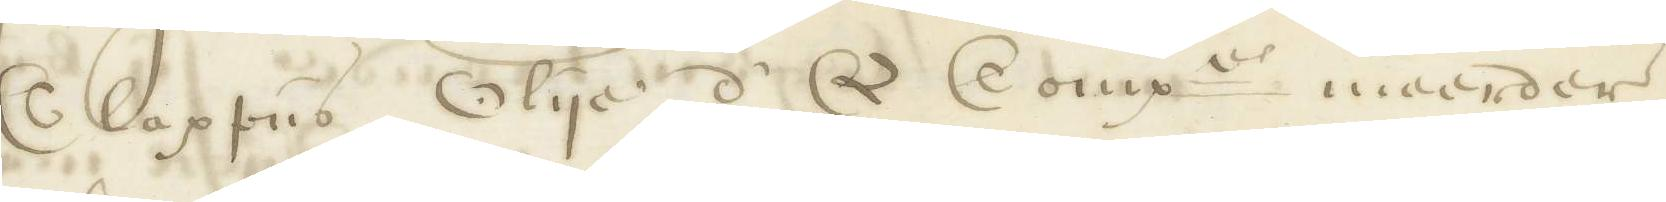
Clappus Olije d' E Comp=e meerder
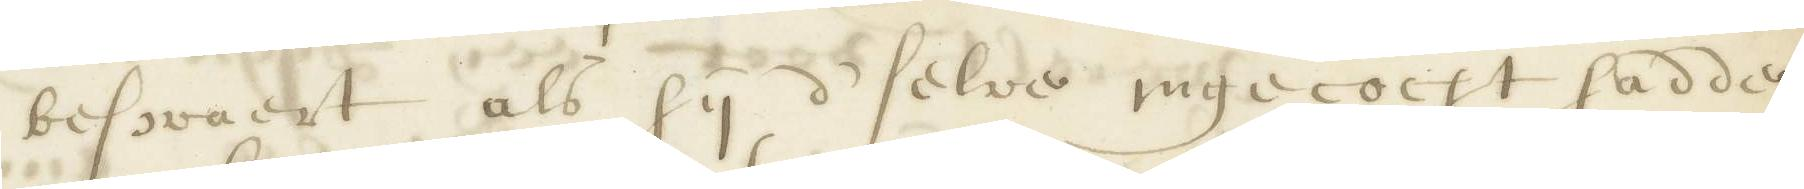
beswaert als hij d’selve ingecocht hadde,
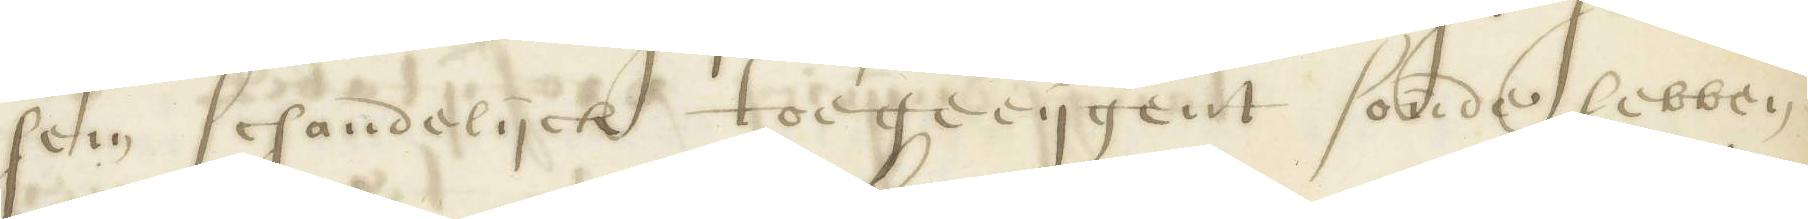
hem schandelijck toegeeijgent soude hebben
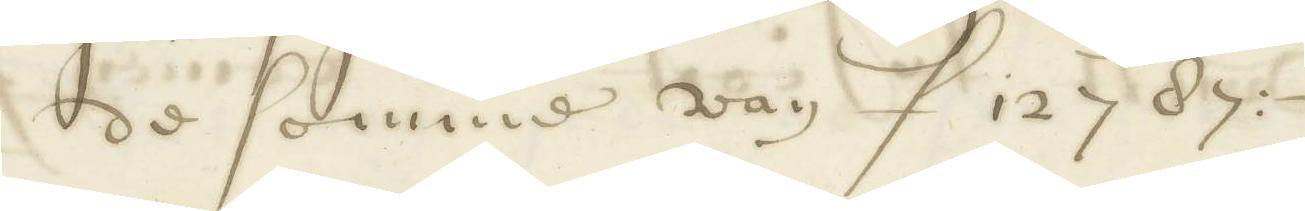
de somme van ƒ 127 87:-
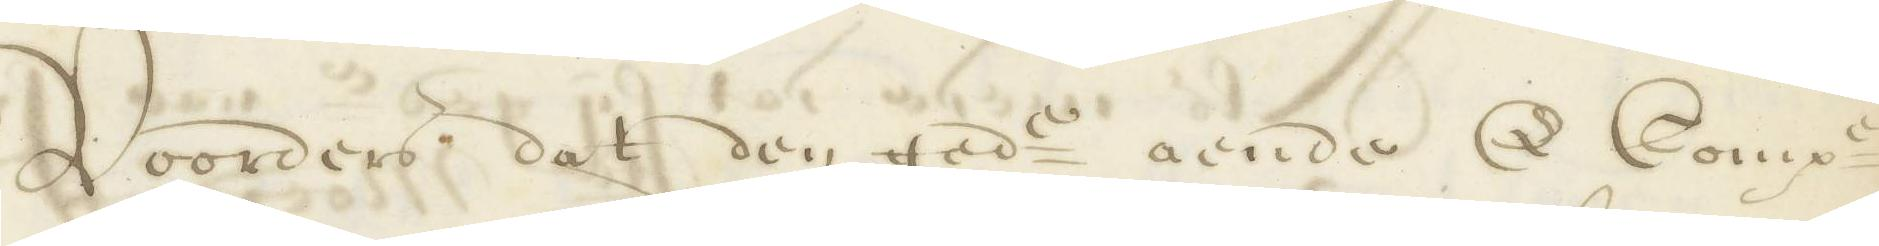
Voorders dat den ged=e aende E Comp=e
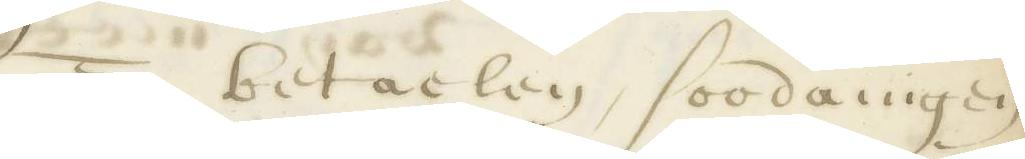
en betaelen, soodanigen
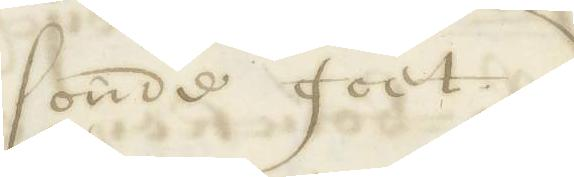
soude goet
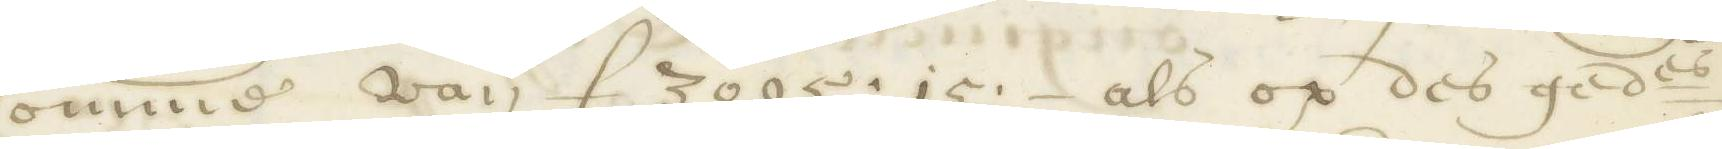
somme van ƒ 3095: 15: — als op des ged=es
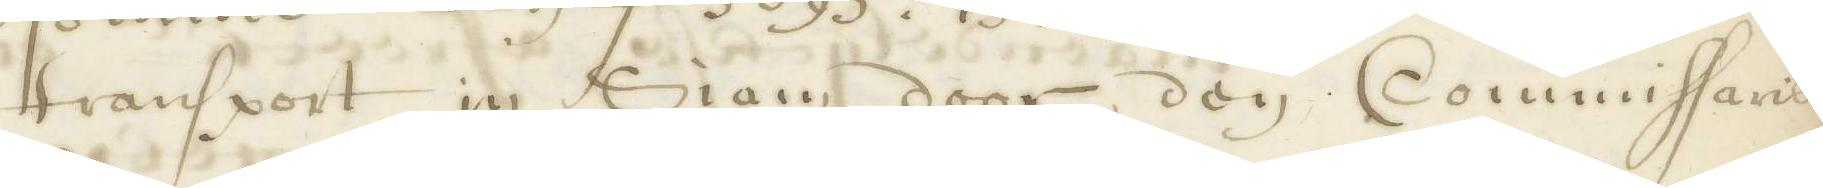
transport in Siam door den Commissaris
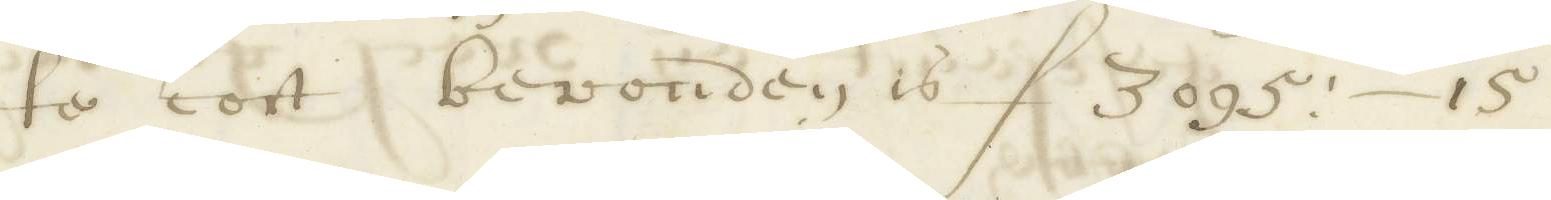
te cort bevonden is ƒ 3095: —15
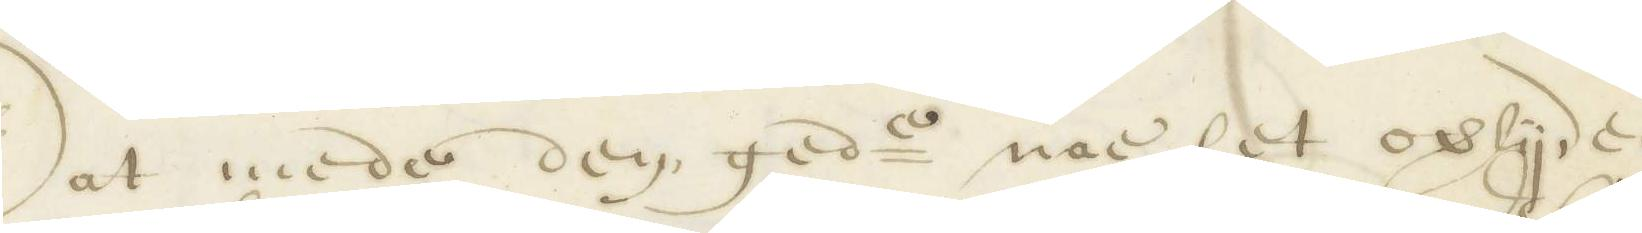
Dat mede den ged=e nae dat overlijden
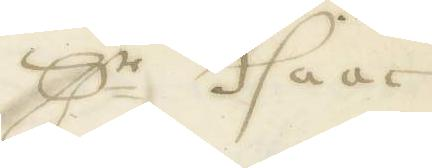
H=r Isaac
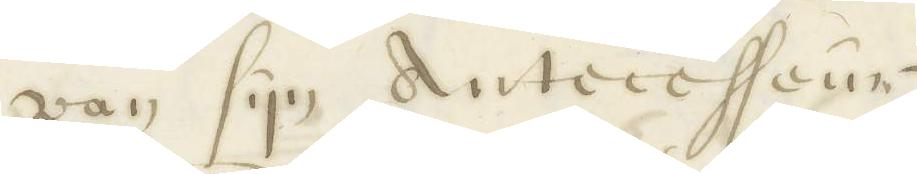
van sijn Antecesseur
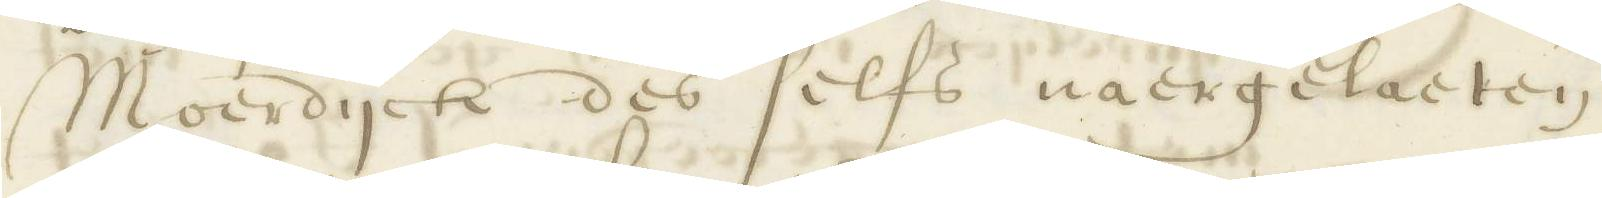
Moerdijck des selfs naergelaeten
